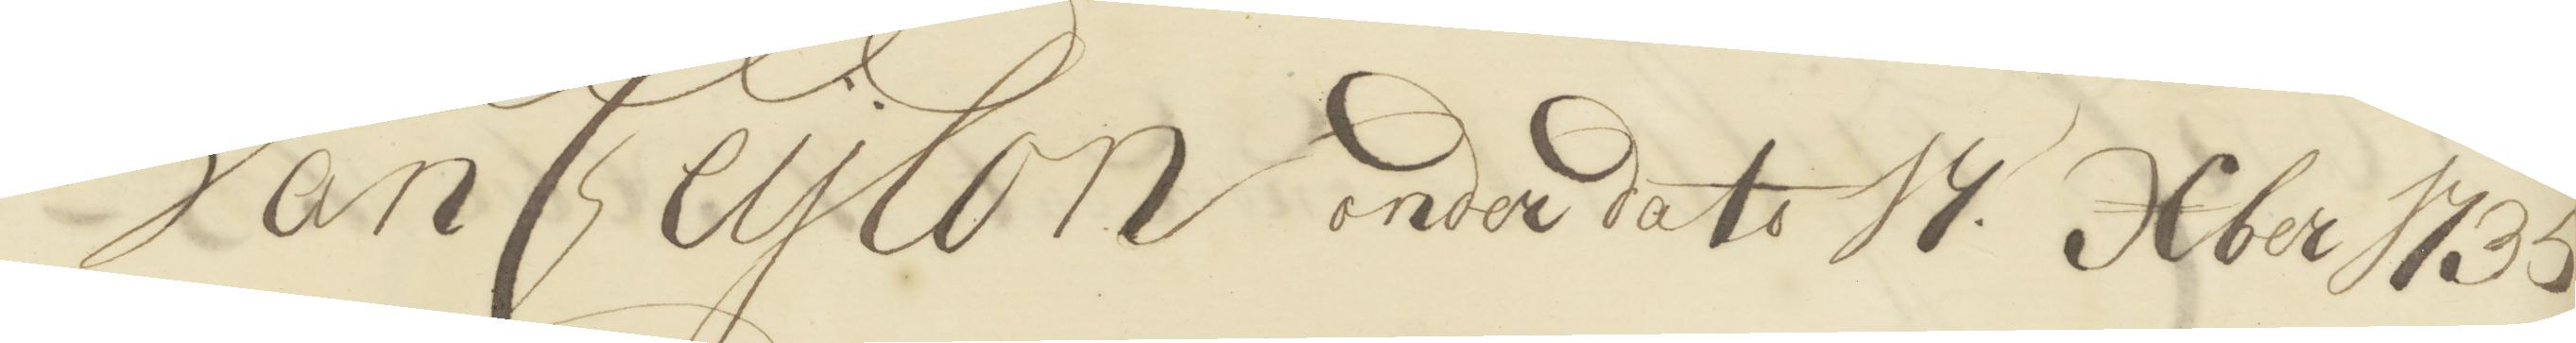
Van Ceijlon onder dato 17' Xber 1735
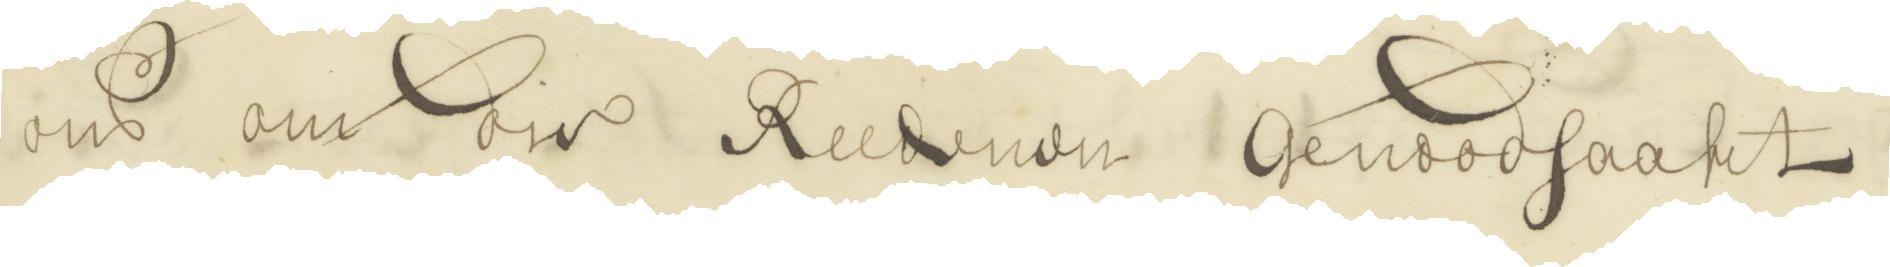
ons om die Reedenen genoodsaakt
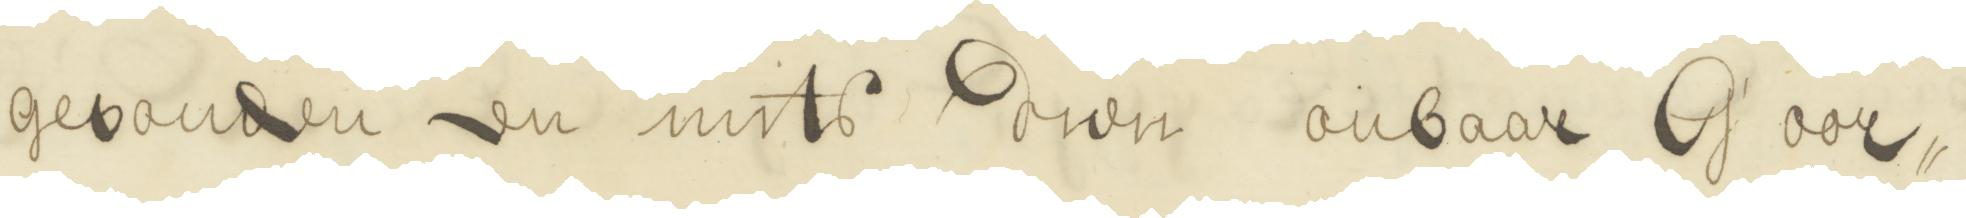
gevonden en mits dien onbaar G' oor„
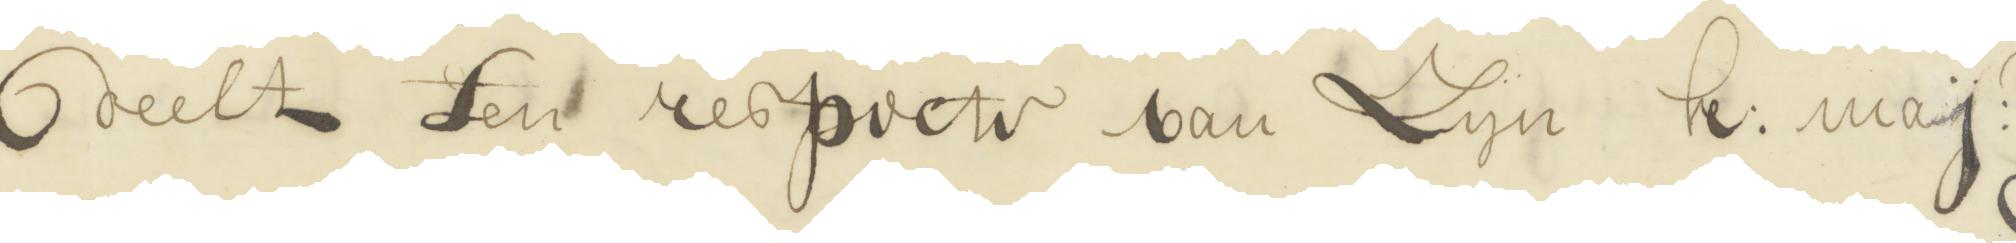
deelt ten respecte van Zijn k: maij:'
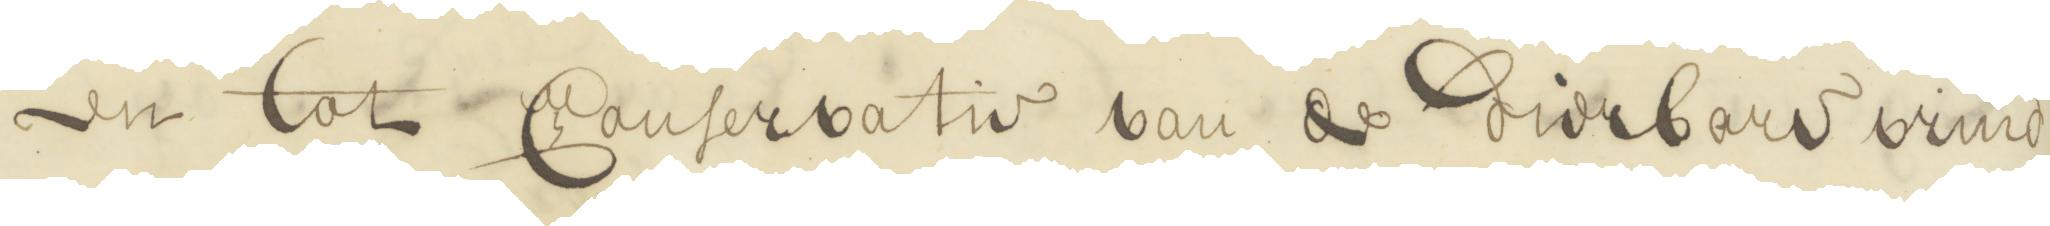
en tot Conservatie van de dierbare vrind
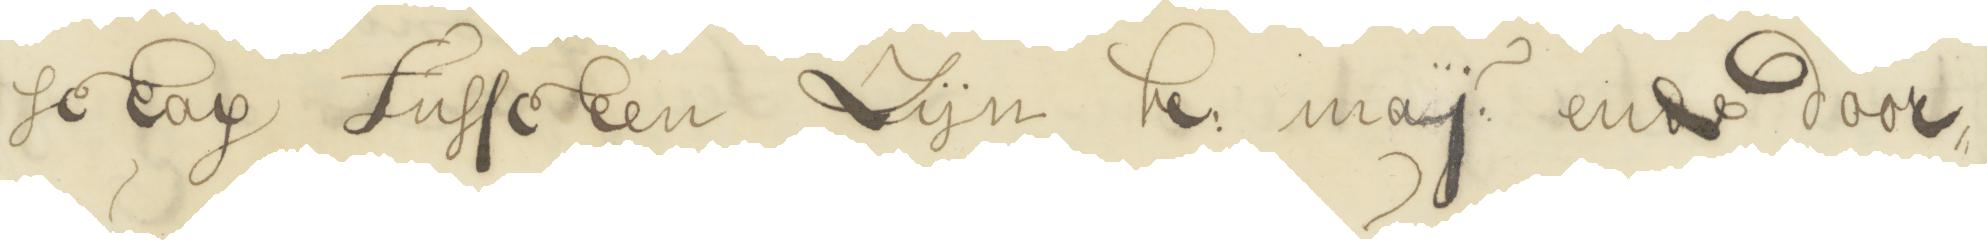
schap tusschen Zijn k: maij:' ende door„
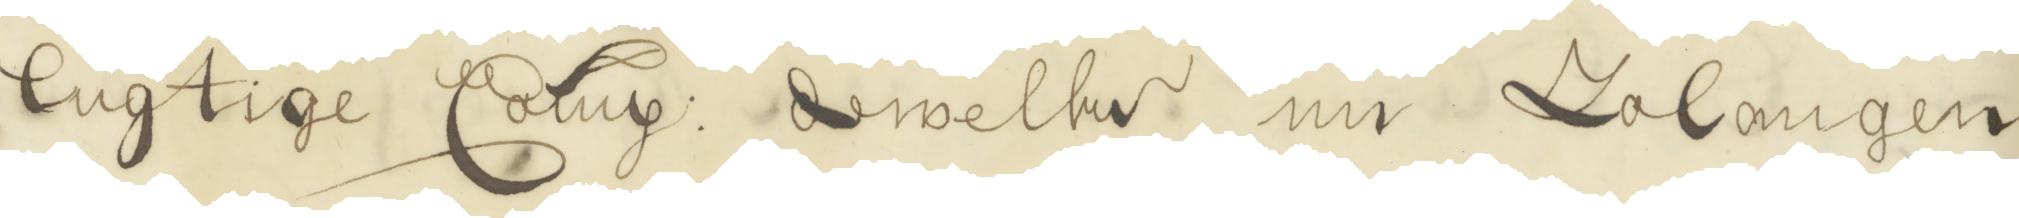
lugtige Comp: dewelke nu Zolangen
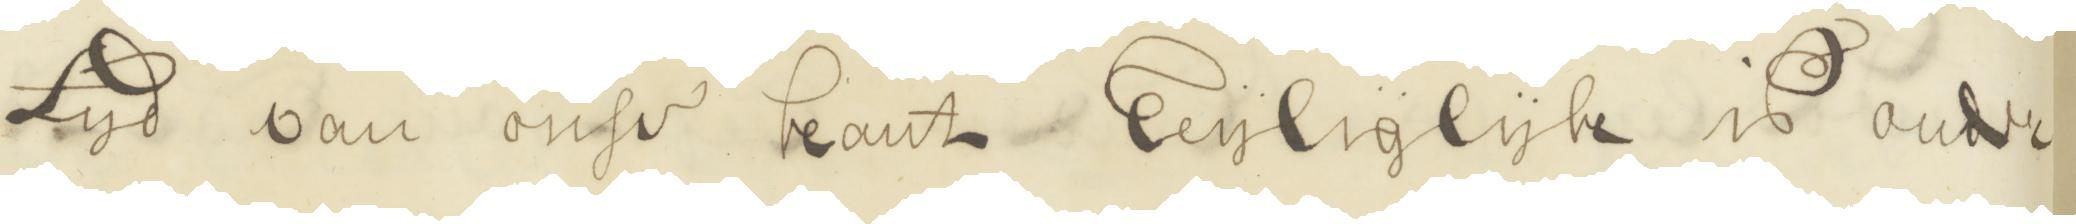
Tyd van onse kant heijliglijk is onder
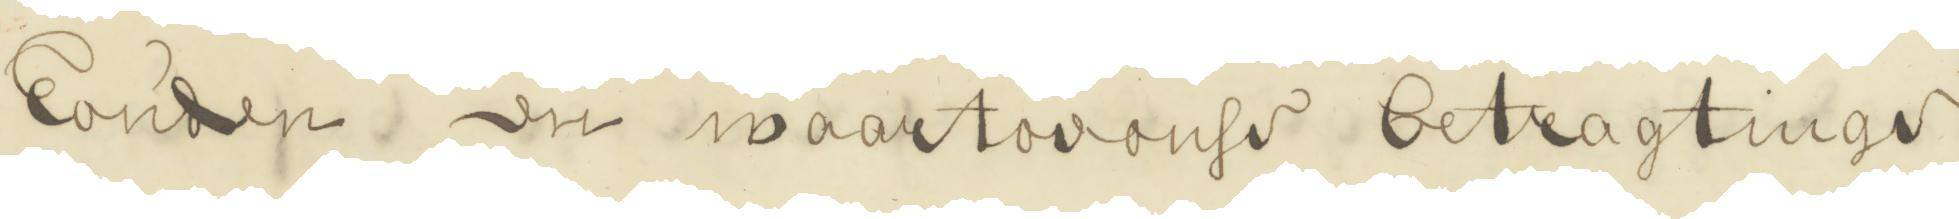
houden en waartoe onse betragtinge
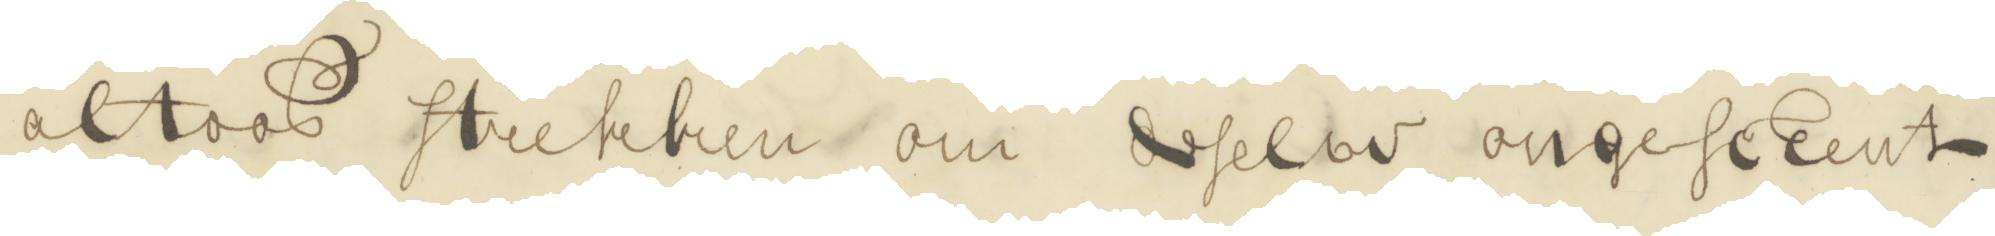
altoos strekken om deselve ongeschent
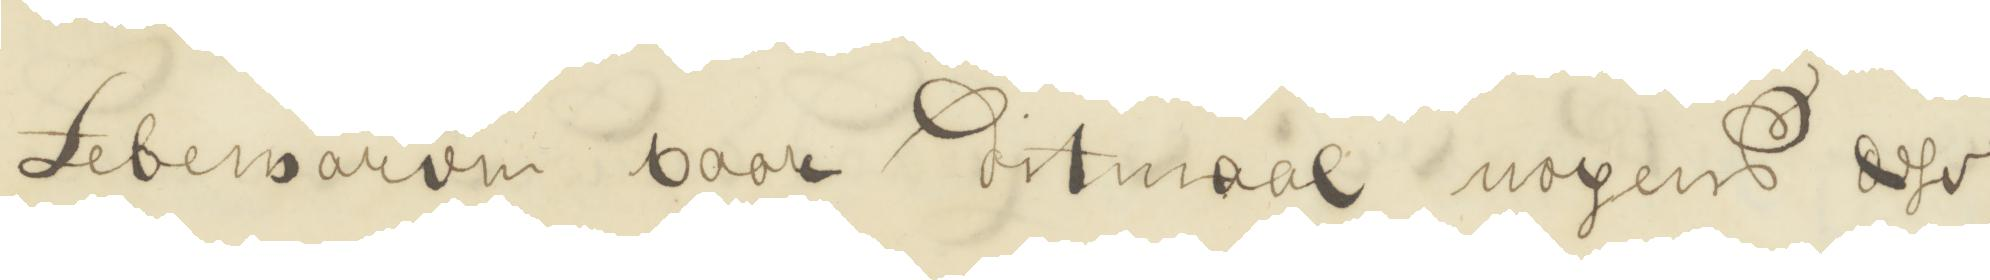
te bewaren voor ditmaal nopens dese
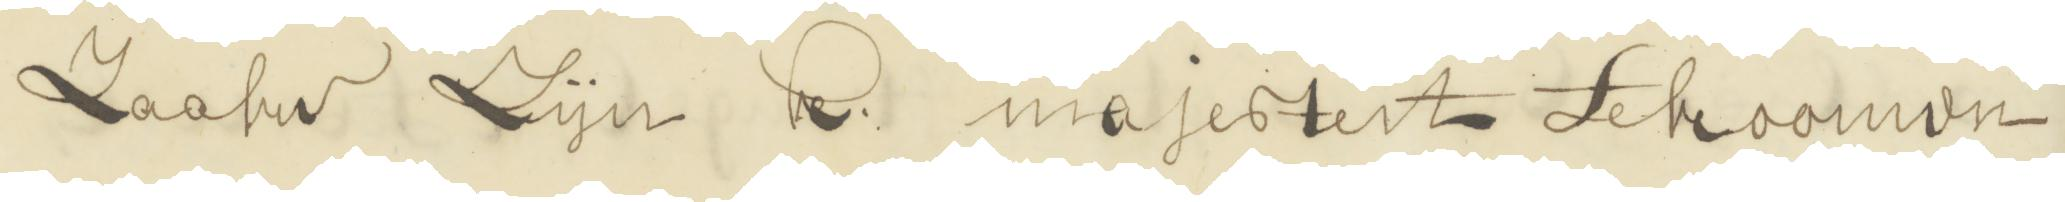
Zaake Zijn k: majesteit te koomen
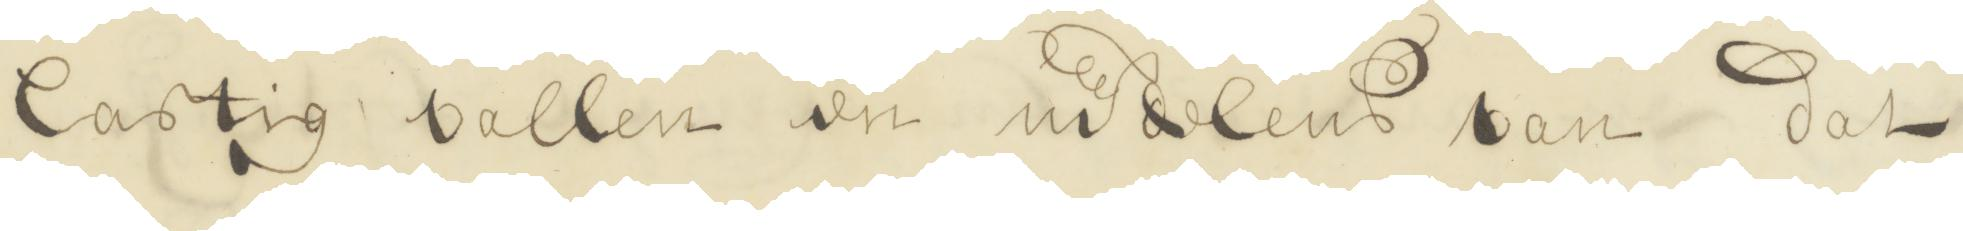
lastig vallen en uEdelens van dat
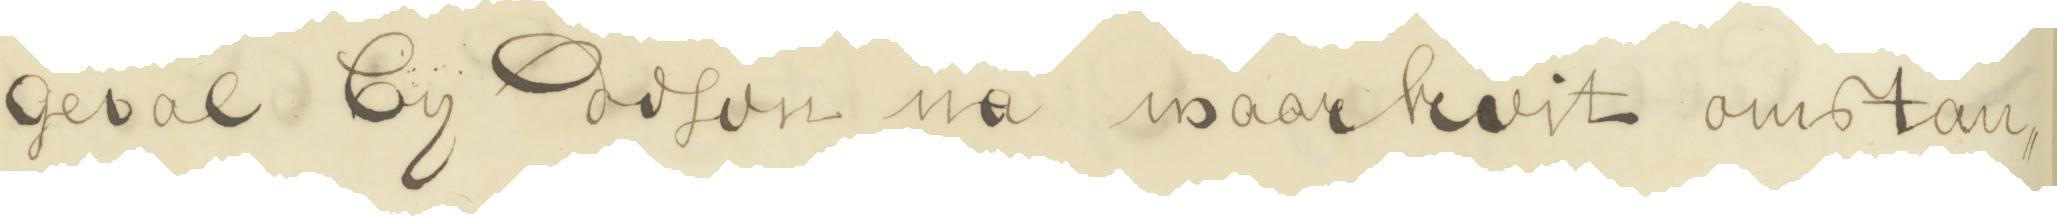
geval bij desen na waarheit omstan„
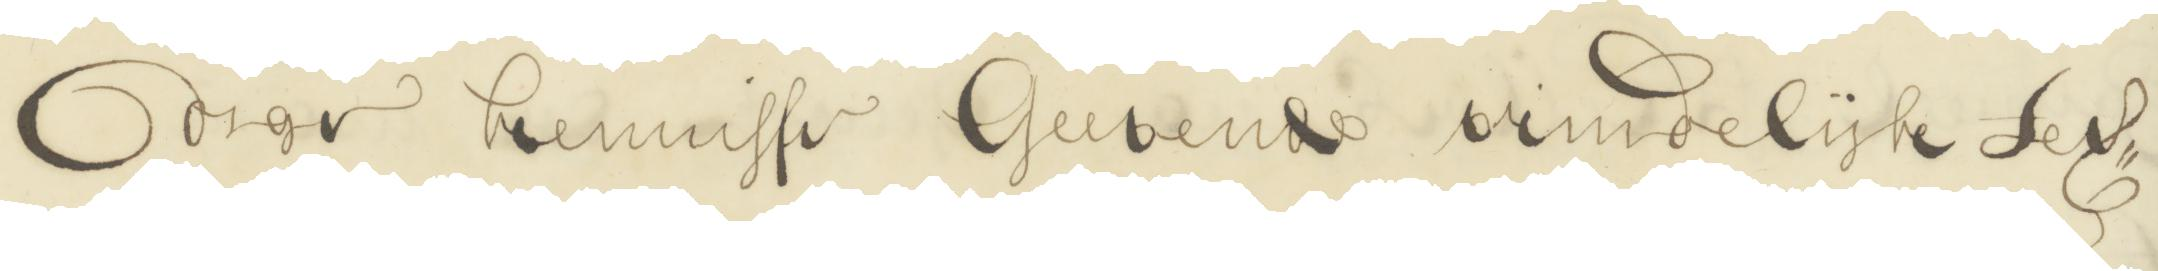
dige kennisse Geevende vrindelijk te ver„
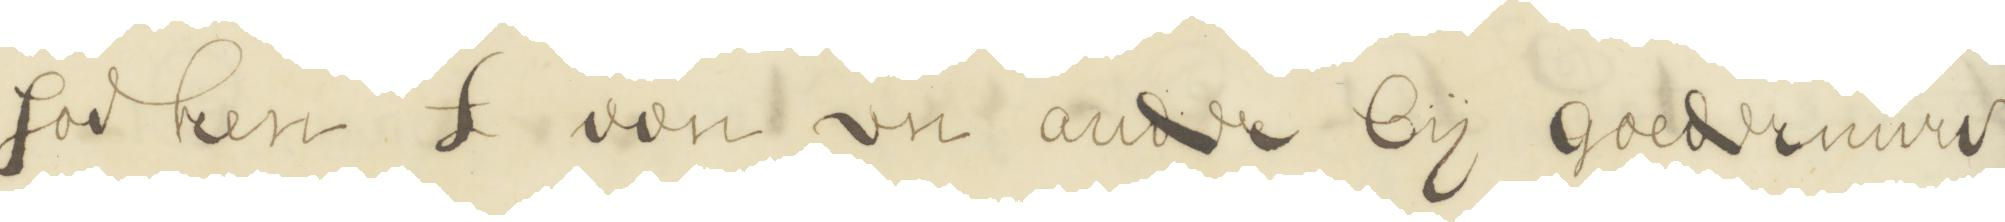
soeken t een en ander bij goeder uure
